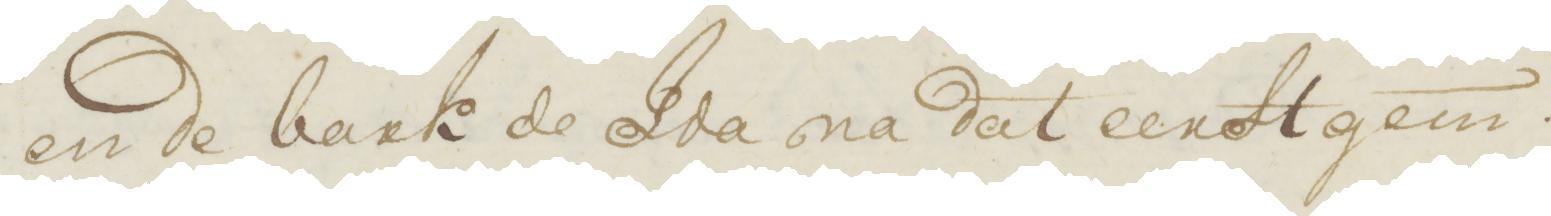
en de bark de Ida na dat eerstgem:
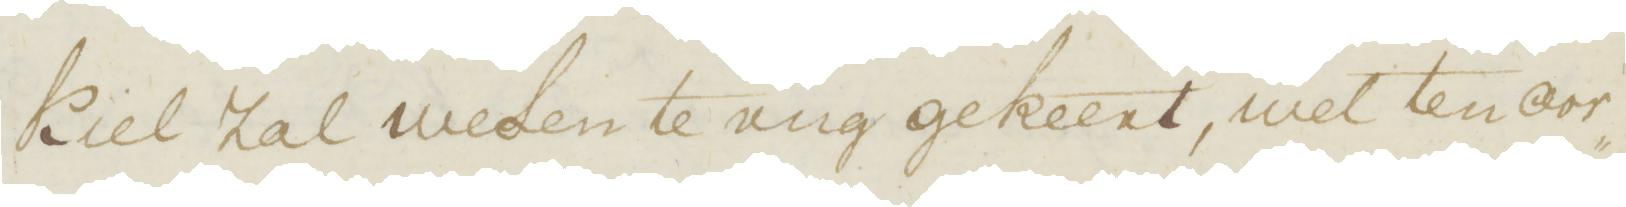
Kiel zal wesen te rug gekeert, wel ten oor„
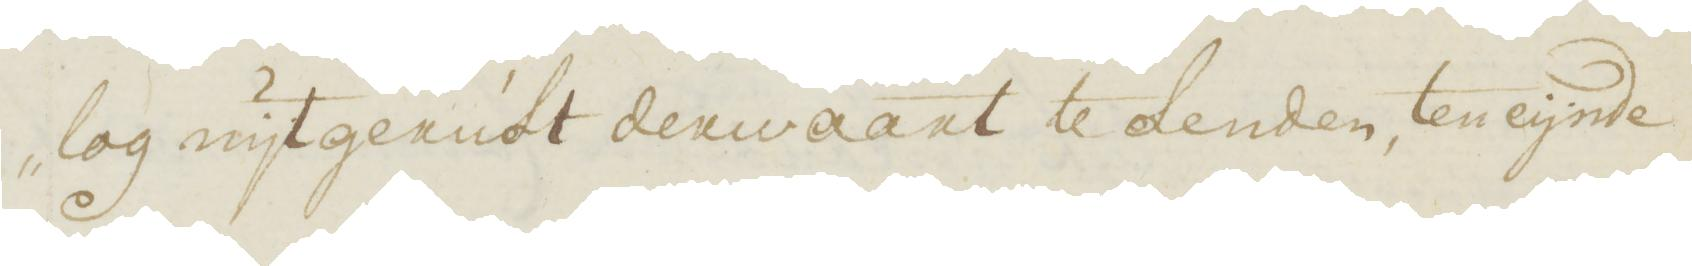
„log uijtgerust derwaart te senden, ten eijnde
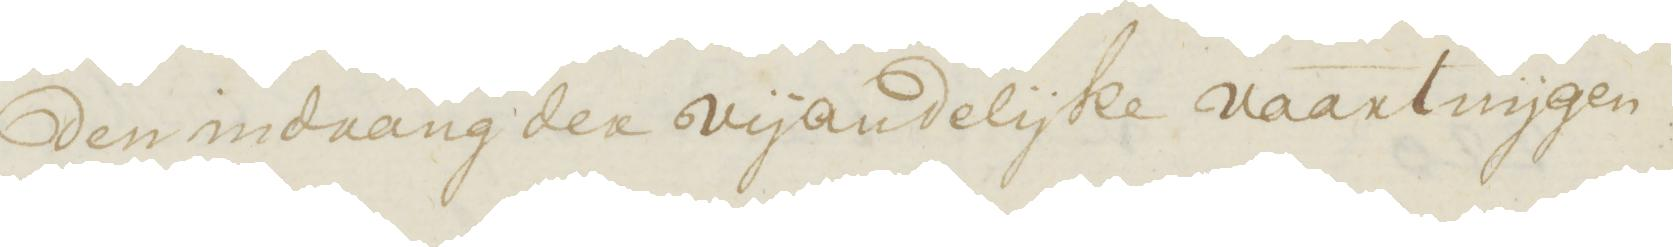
den indrang der vijandelijke vaartuijgen
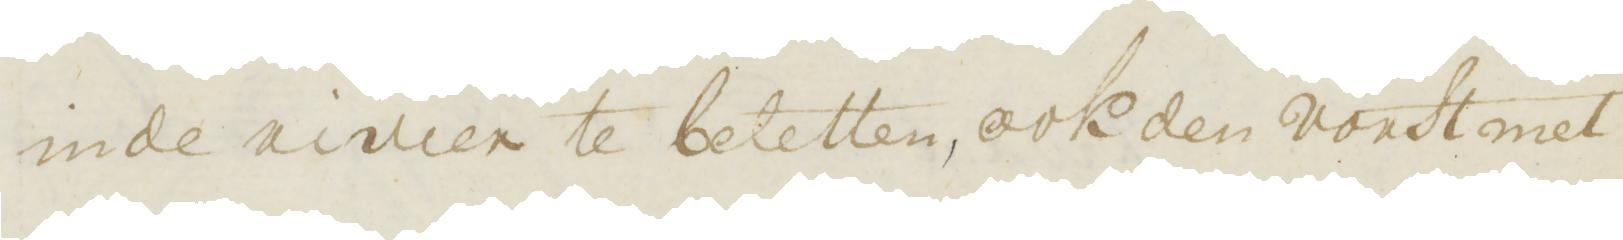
inde rivier te beletten, ook den vorst met
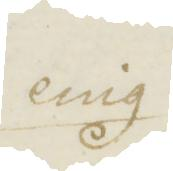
enig
